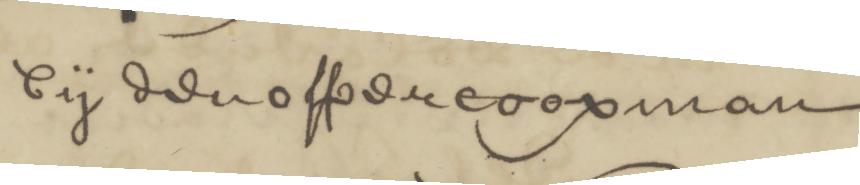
bij den oppercoopman
